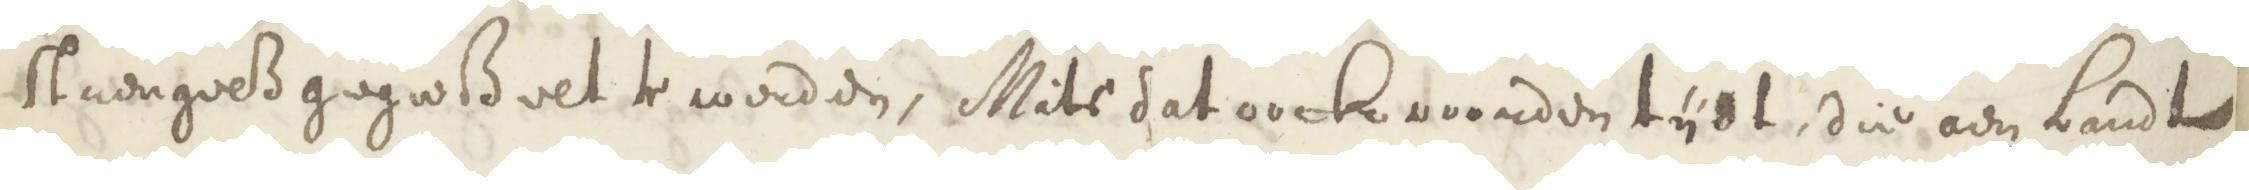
staengelijk gegeeꞵelt te werden, Mits dat oock voorden tijdt, die aen Landt
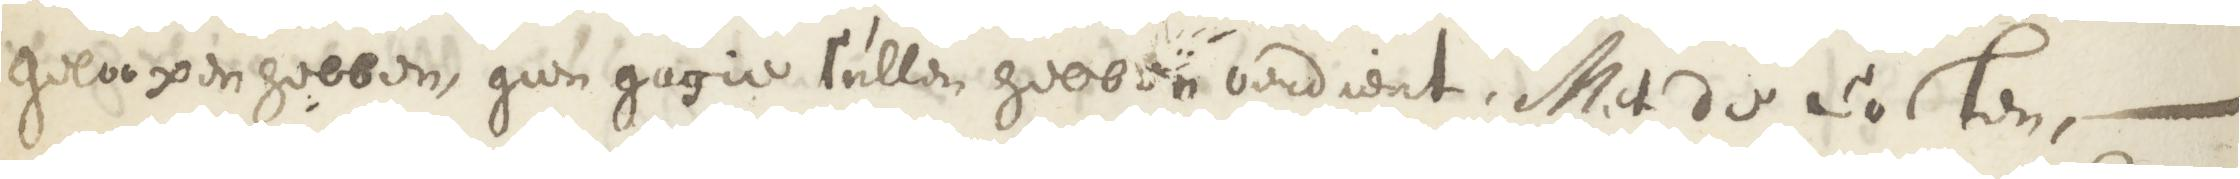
geloopen hebben, geen gagie sullen hebben verdient, Met de Costen, —
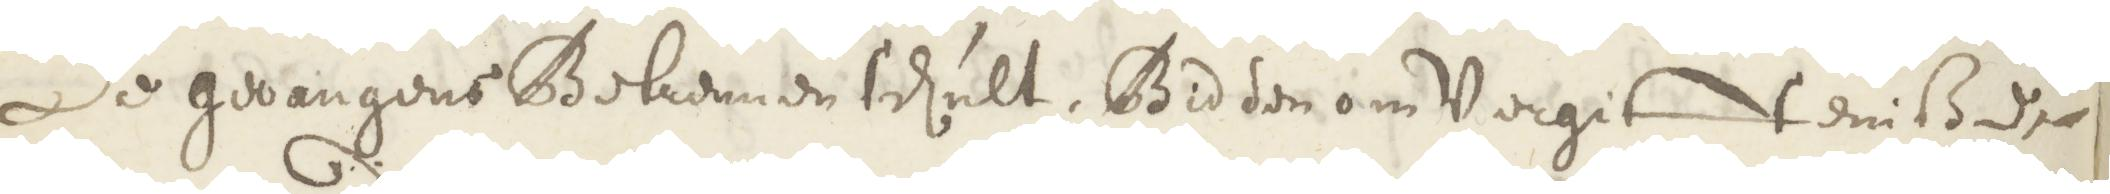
De gevangens Bekennen Schult, Bidden om Vergiffenisse, -
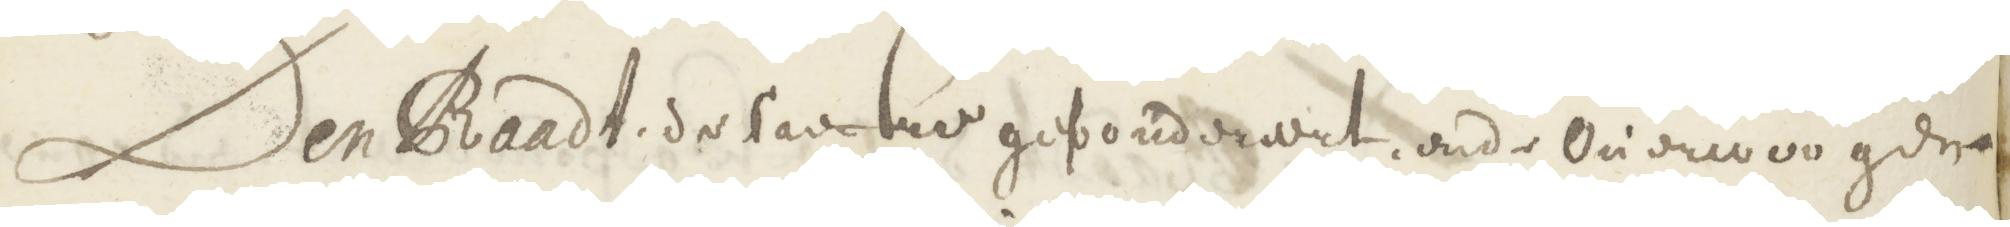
Den Raadt de saecke gepondereert ende Overwoogen —
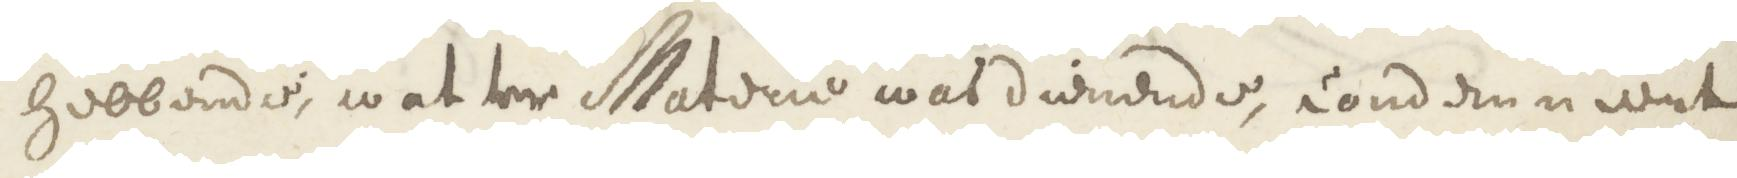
hebbende, wat ter Materie was dienende, condemneert
